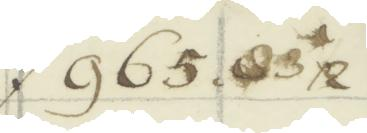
ƒ 965 „ 83½
